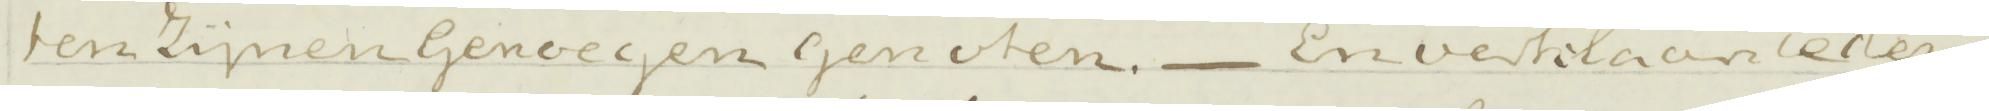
ten zijnen Genoegen genoten. — En verklaarde den
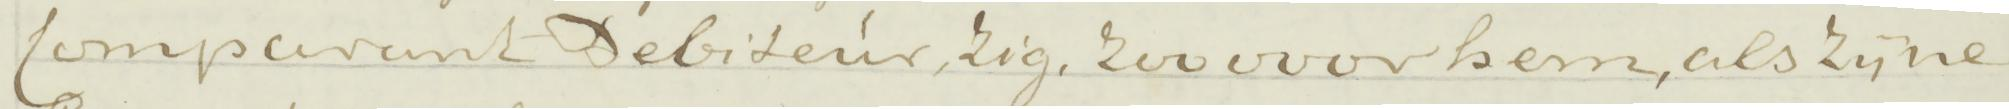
Comparant Debiteur, zig, zoo voor hem, als zijne
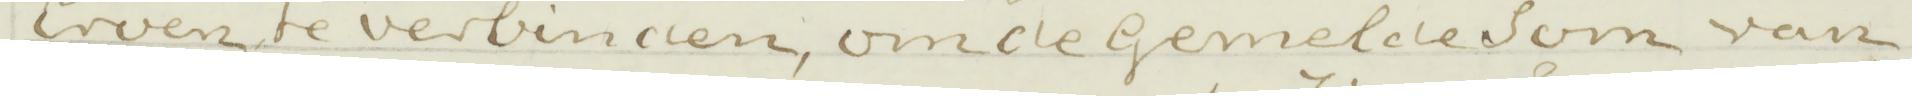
Erven, te verbinden, om de gemelde som van
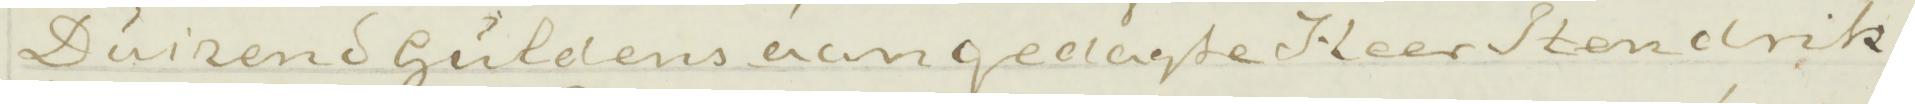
Duizend Guldens aan gedagte Heer Hendrik
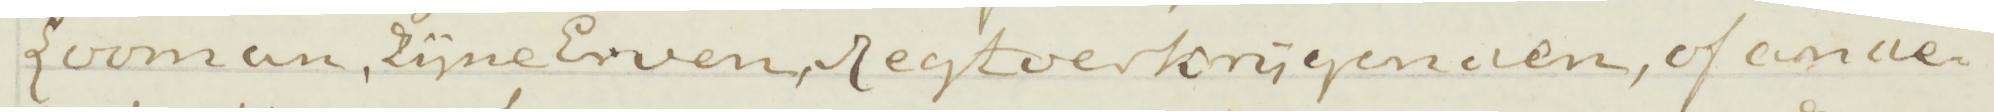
Looman, zijne Erven, Regtverkrijgenden, of ande=
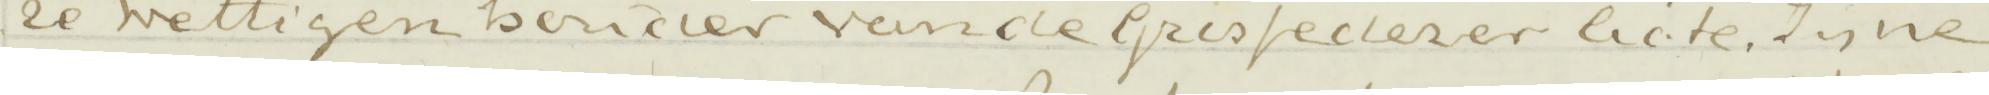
re wettigen houder van de Grosse dezer Acte, zyne
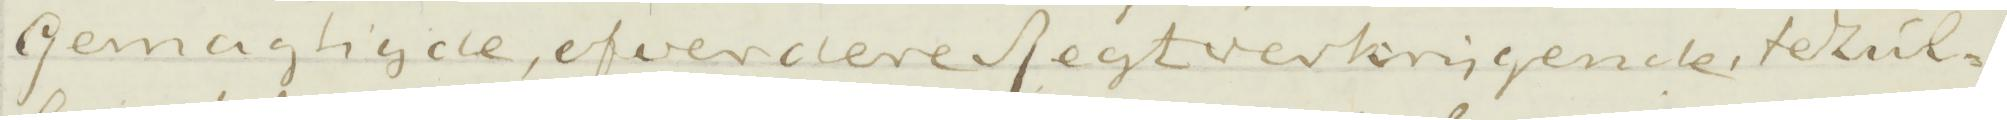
Gemagtigde, of verdere Regt verkrijgende, te zul=
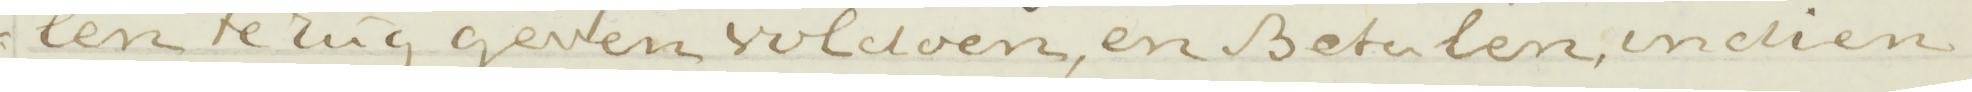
len terug geven voldoen, en Betalen, indien
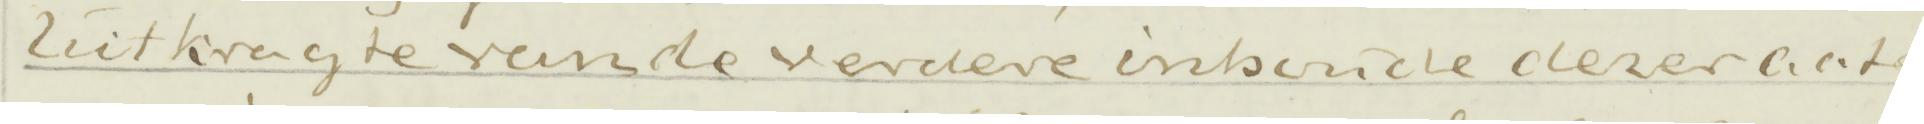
uitkragte van de verdere inhoude dezer acte,
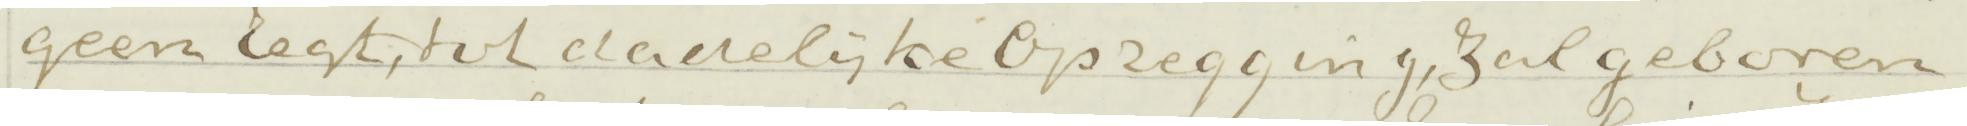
geen regt, tot dadelijke opzegging, zal geboren
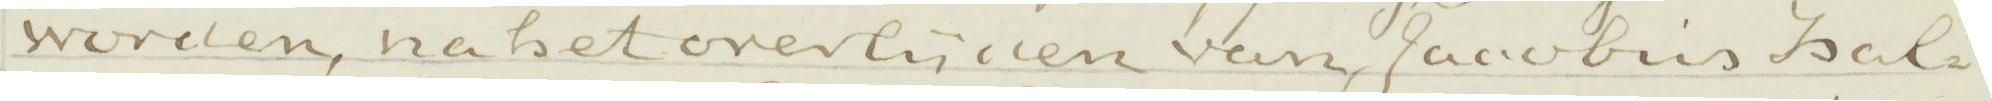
worden, na het overlijden van Jacobus hal=
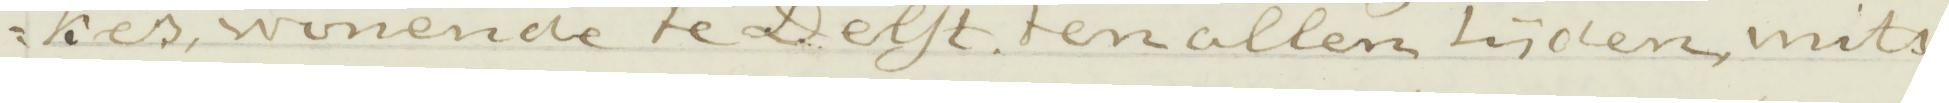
=kes, wonende te Delft, ten allen tijden, mits
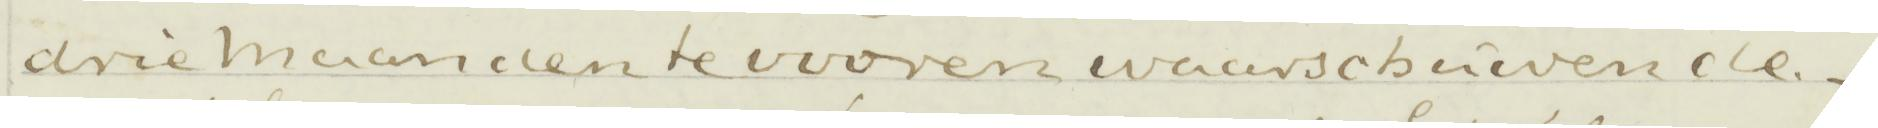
drie maanden te vooren waarschuwende. _
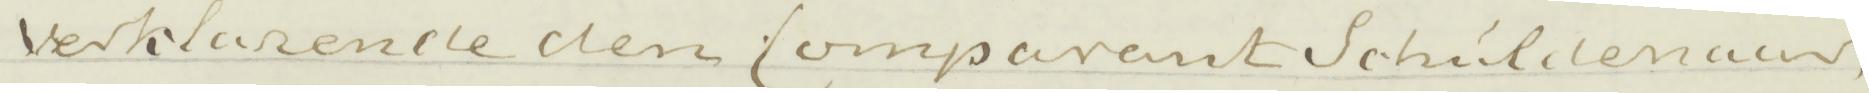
verklarende den Comparant Schuldenaar
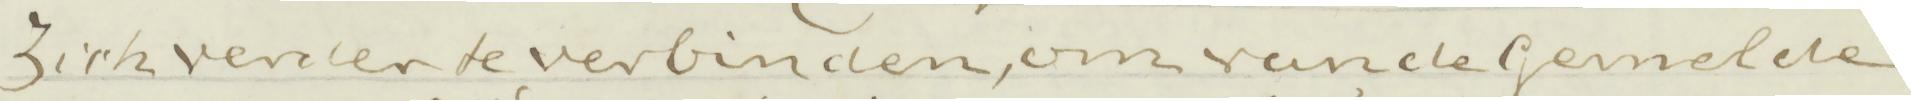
zich verder te verbinden, om van de gemelde
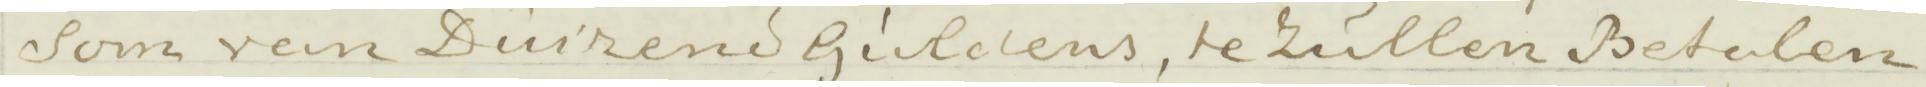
som van Duizend Guldens, te zullen Betalen
